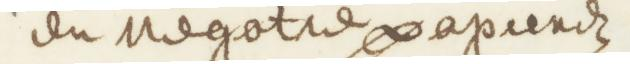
en negotie papieren
